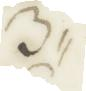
3„
